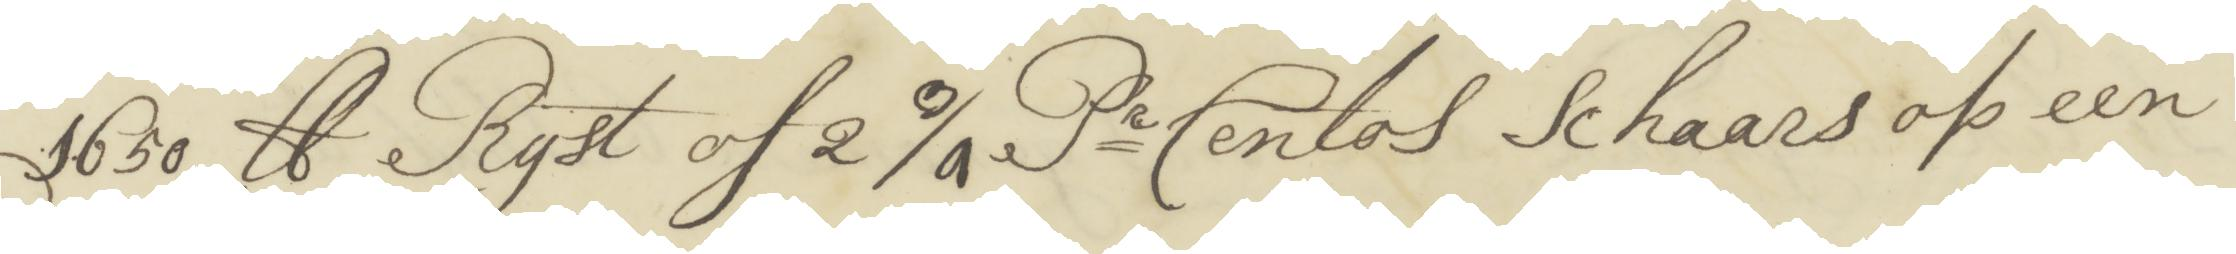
1650 lb Rijst of 2¾ P=r Centos schaars op een
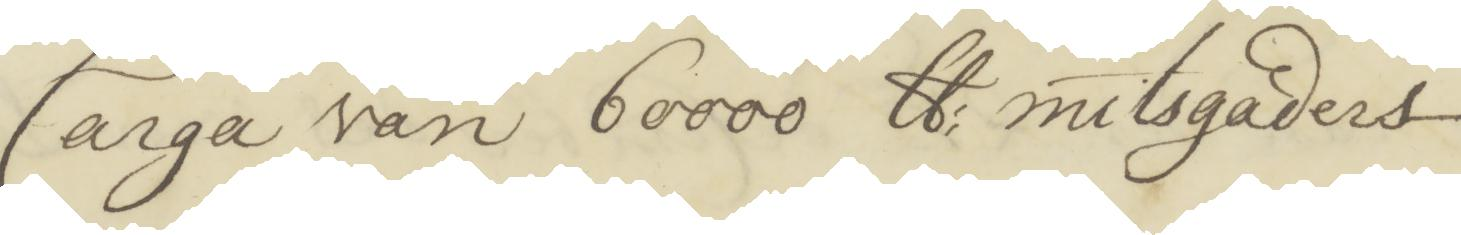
Carga van 60000 lb: mitsgaders
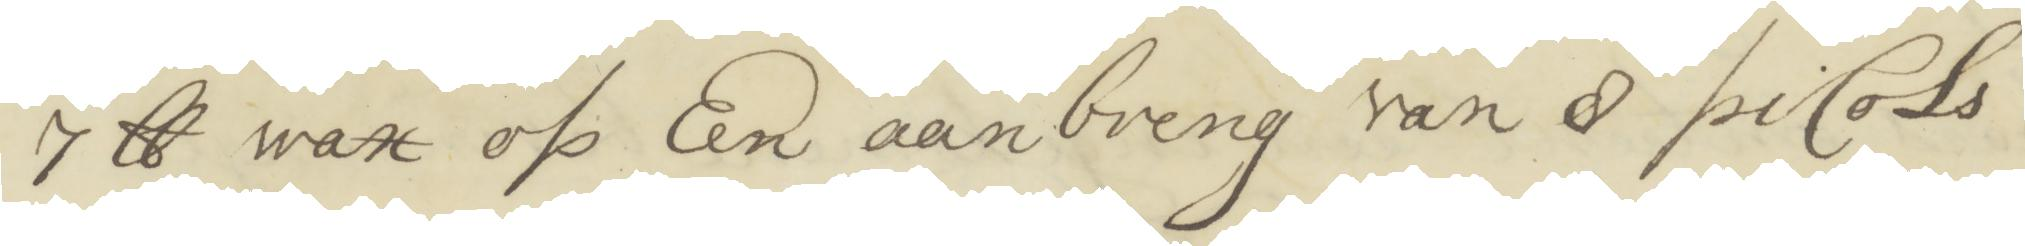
7 lb wax op Een aanbreng van 8 picols
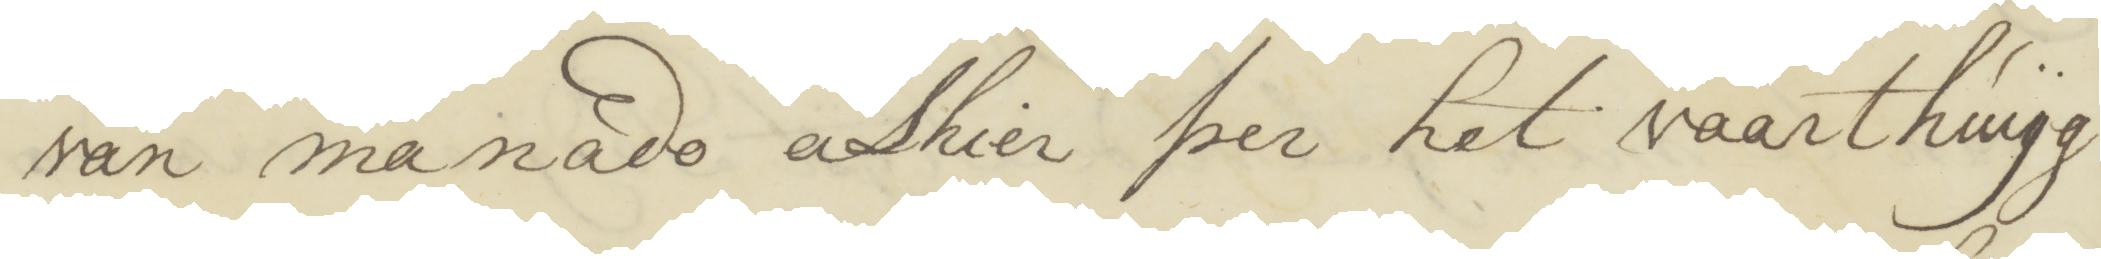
van manado alhier per het vaarthuijg
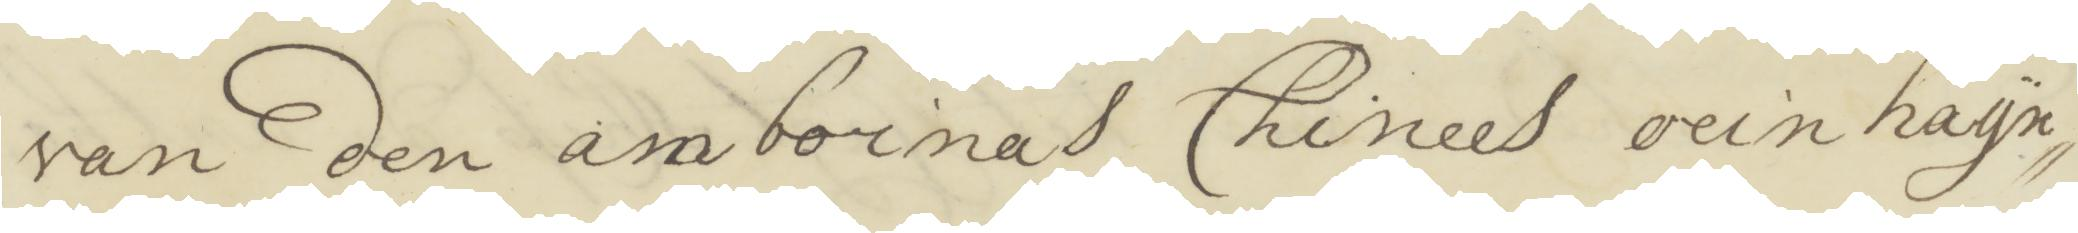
van den amboinas Chinees oein haijn„
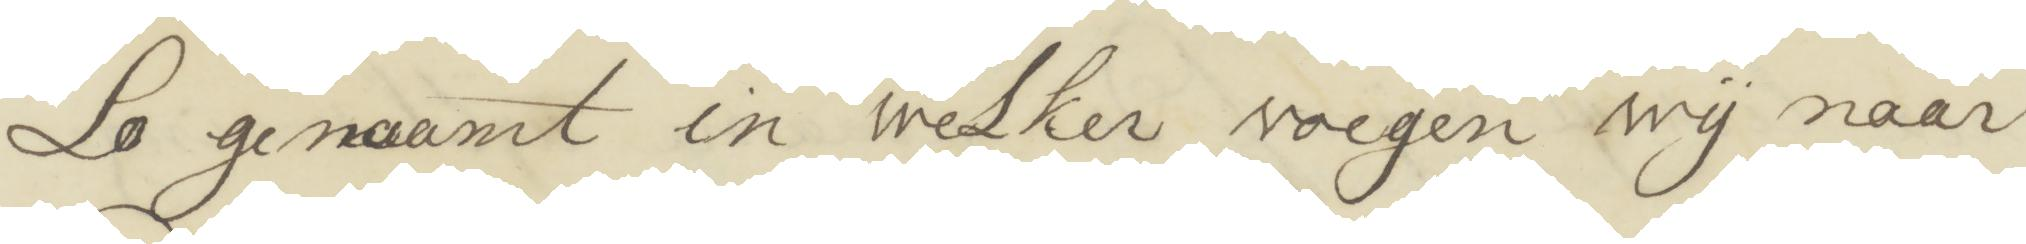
Lo genaamt in welker voegen wij naar
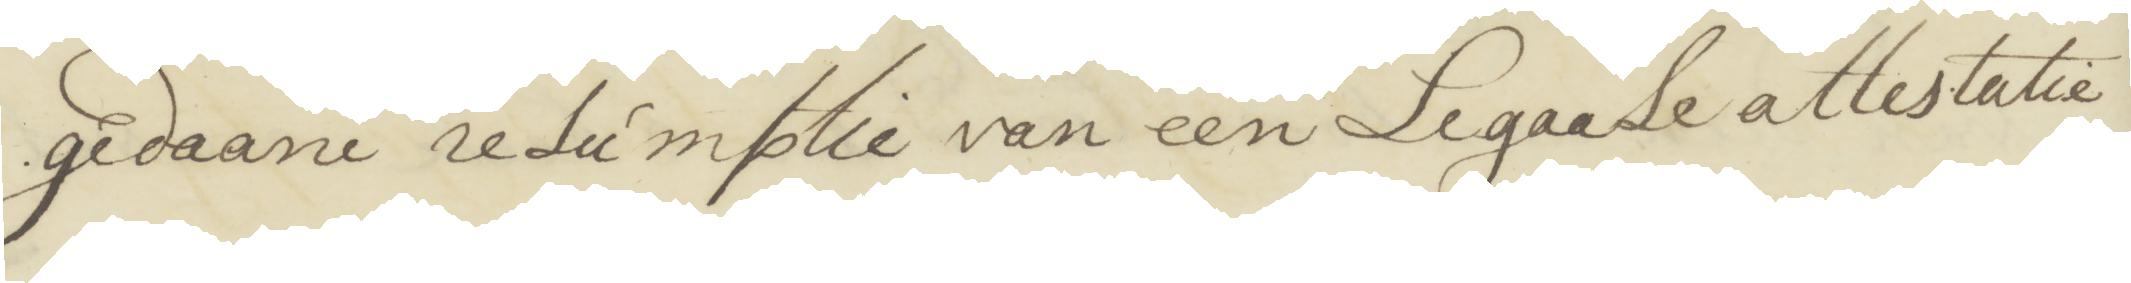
gedaane resumptie van een Legaale attestatie
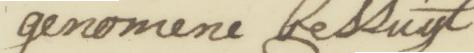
genomene besluijt
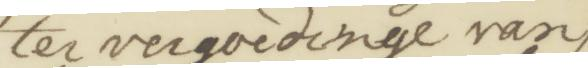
ter vergoedinge van
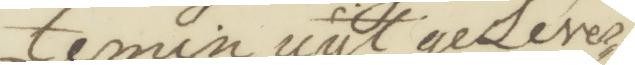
te min uijt gelever„
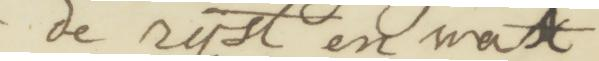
de rijst en wax
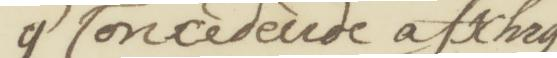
g’Concedende afschrij
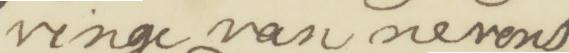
vinge van nevens
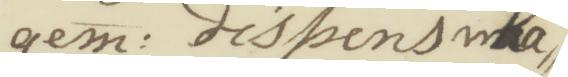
gem: dispens wha„
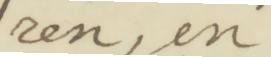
ren, en
